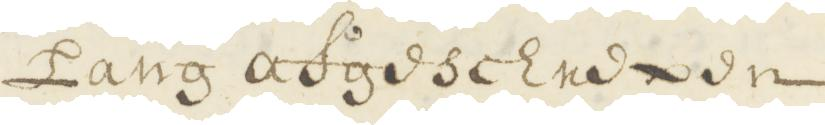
lang afgeschrepen.
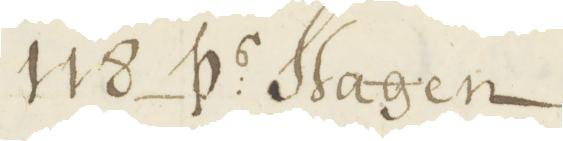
118 p:s stagen
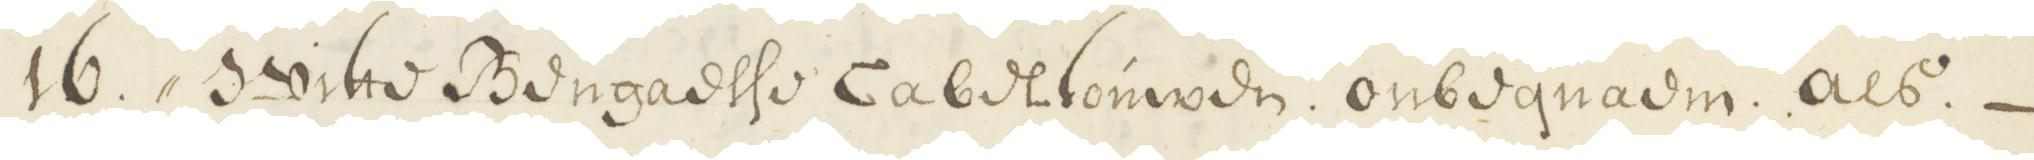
16. „ witte Bengaelse Cabeltouwen. onbeqnaem. als. -
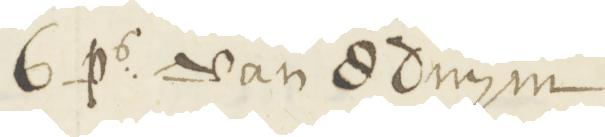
6 p:s van 8 duijm
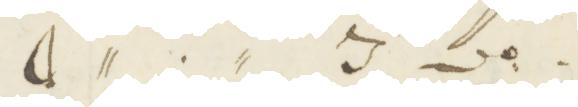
4 „ . „ 7 d:o
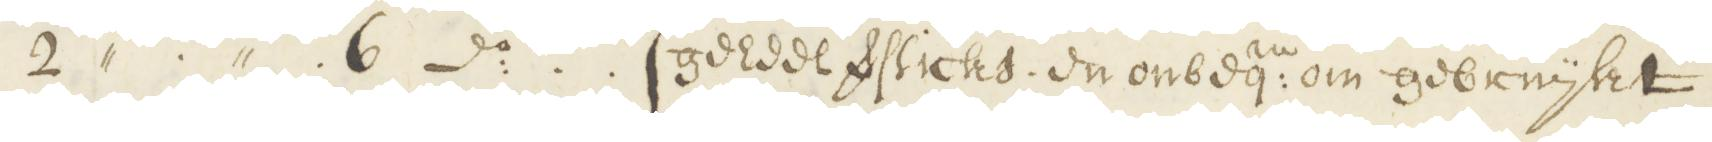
2 „ . „ 6 d:o geheel verstickt. En onbeq:m om gebruijkt
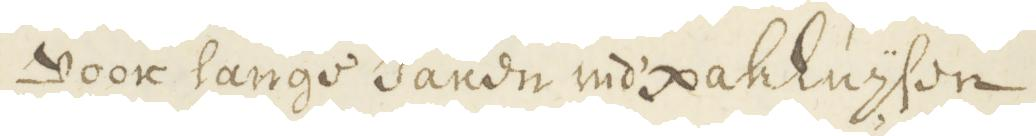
voor lange Jaren in d' pakhuijsen
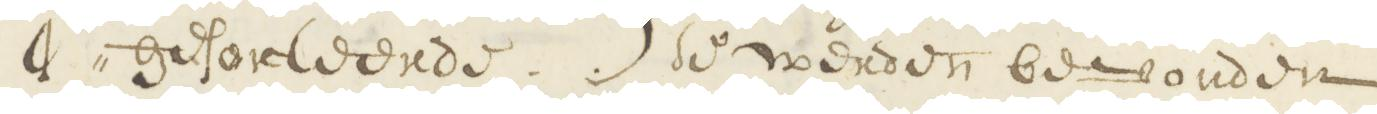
4 „ gesorteerde. te werden bevonden
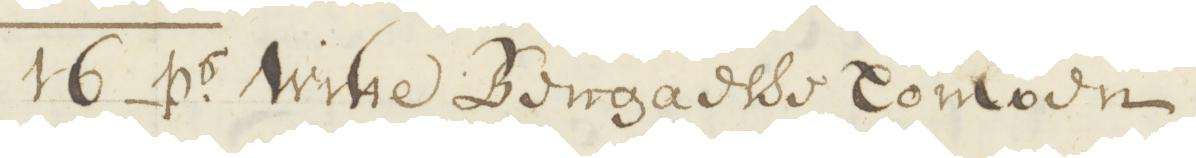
16 p„s Witte Bengaelse Touwen
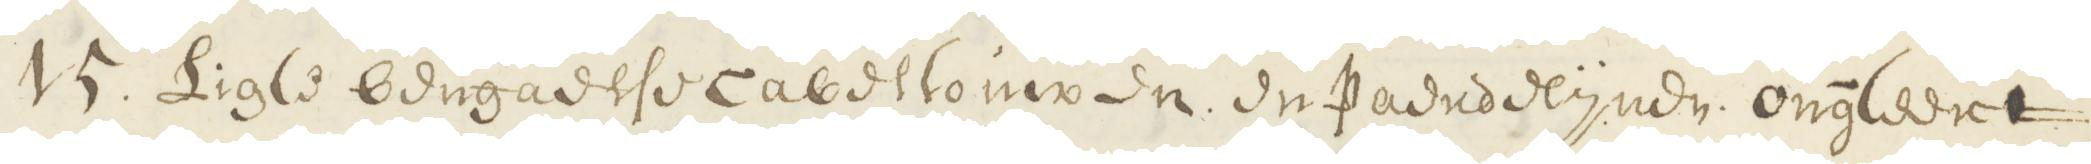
15. Ligte bengaelse cabeltouwen en. en Paerdelijnen. ongteert
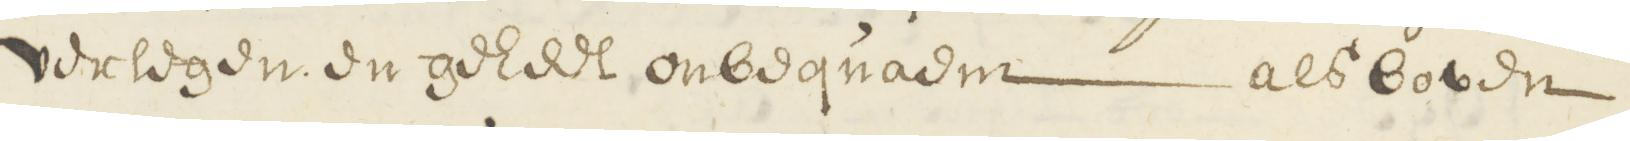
verlegen en geheel onbequaem als boven
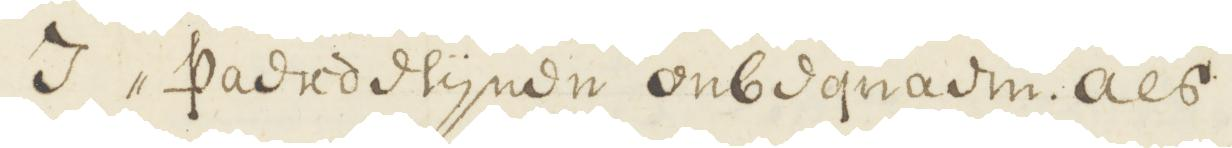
7 „ paerdelijnen onbequaem. als
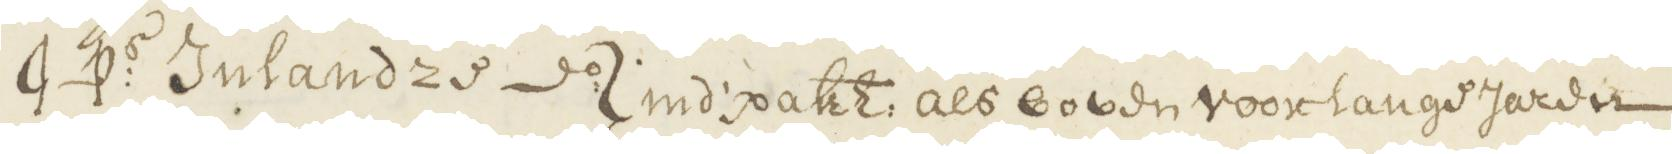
4 p:s Inlandze d:o in d'pakh: als boven voor lange Jaren
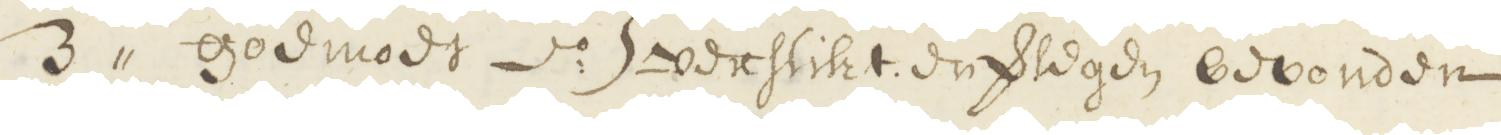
3 „ goemoet d:o verstikt en verlegen bevonden
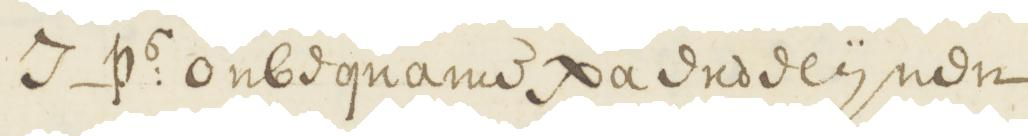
7 p:s onbequame paerdelijnen
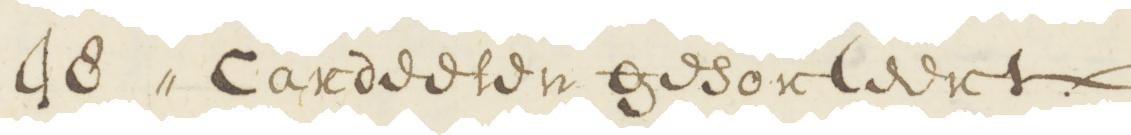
48 „ Cardeelen gesorteert
